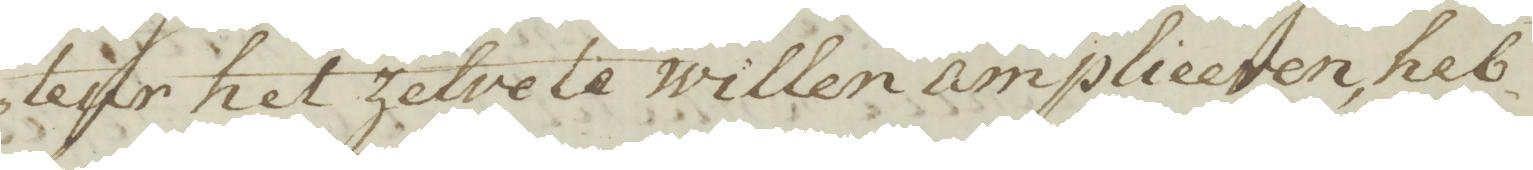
teur het zelve te willen amplieeren, heb„
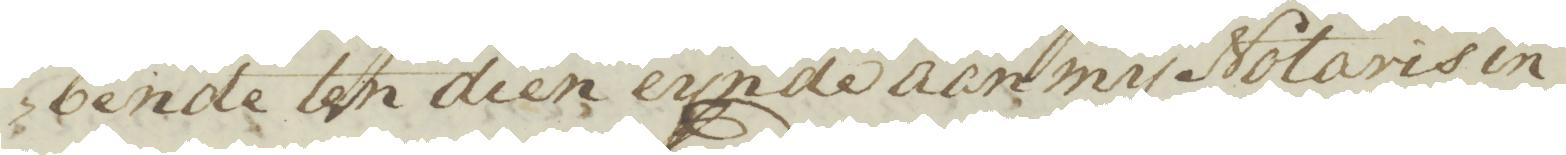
„bende ten dien eynde aan my Notaris in
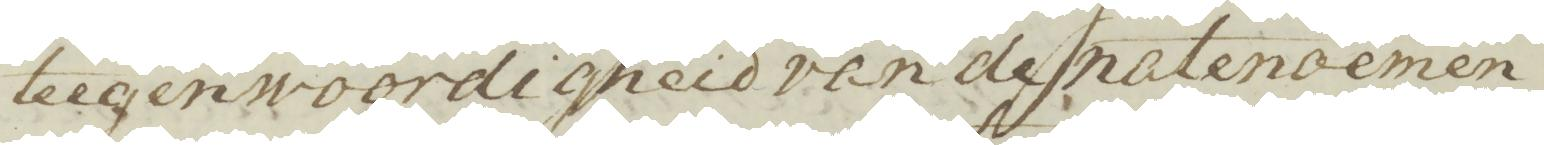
teegenwoordigheid van de natenoemen
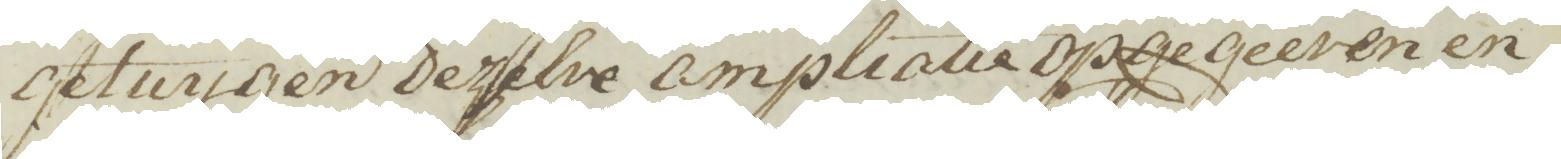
getuigen dezelve ampliatie opgegeeven en
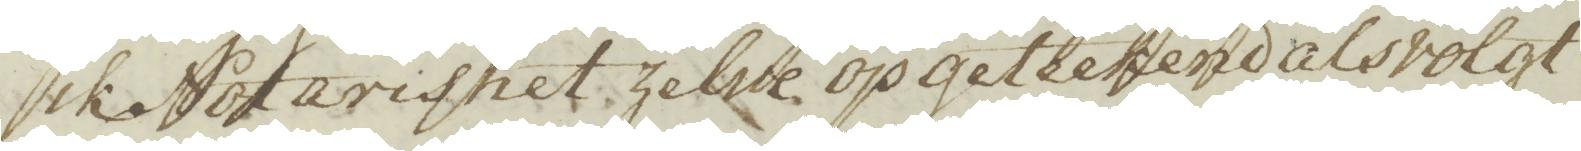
ik Notaris het zelve opgeteekend als volgt
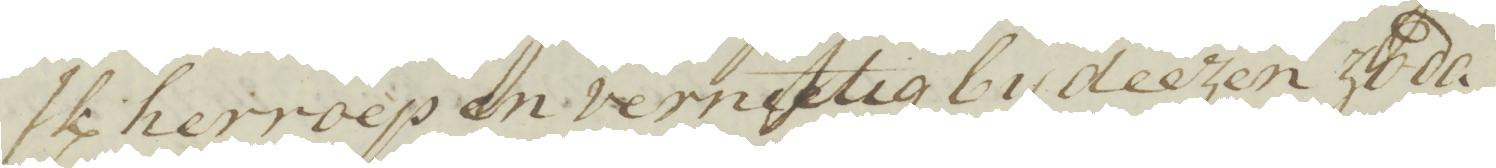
Ik herroep en vernietig by deezen zoda
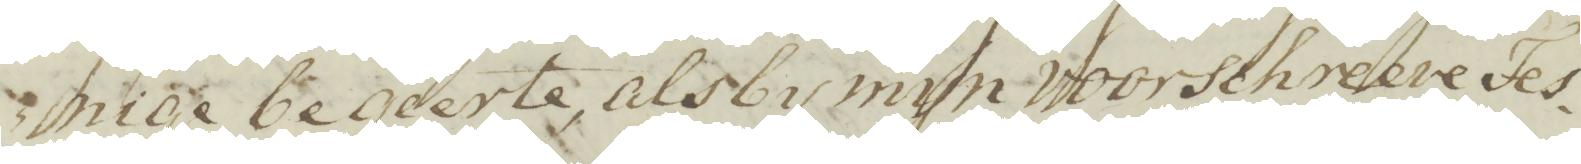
„nige begeerte, als by myn voorschreeve Tes„
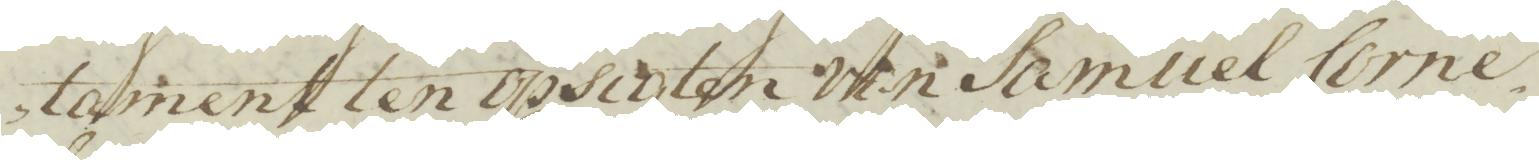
„tament ten opsigten van Samuel Corne„
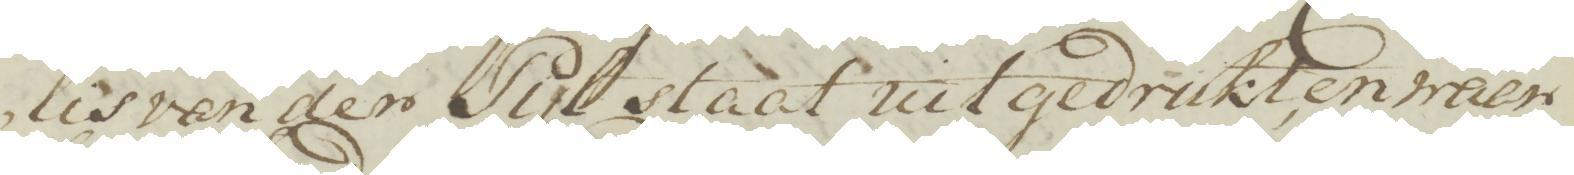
„lis van der Pyl staat uitgedrukt, en waer
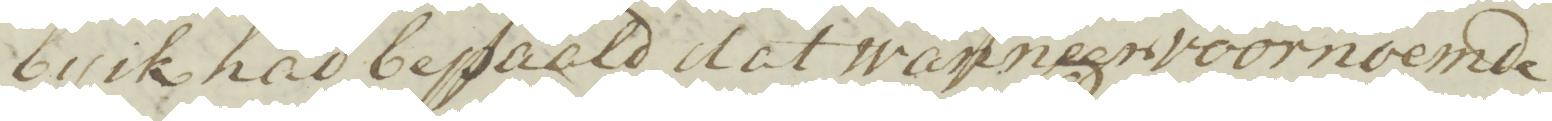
by ik had bepaald, dat wanneer voornoemde
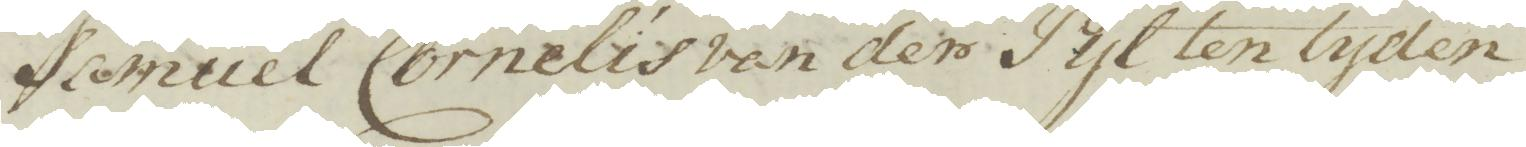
Samuel Cornelis van der Pyl ten tyden
